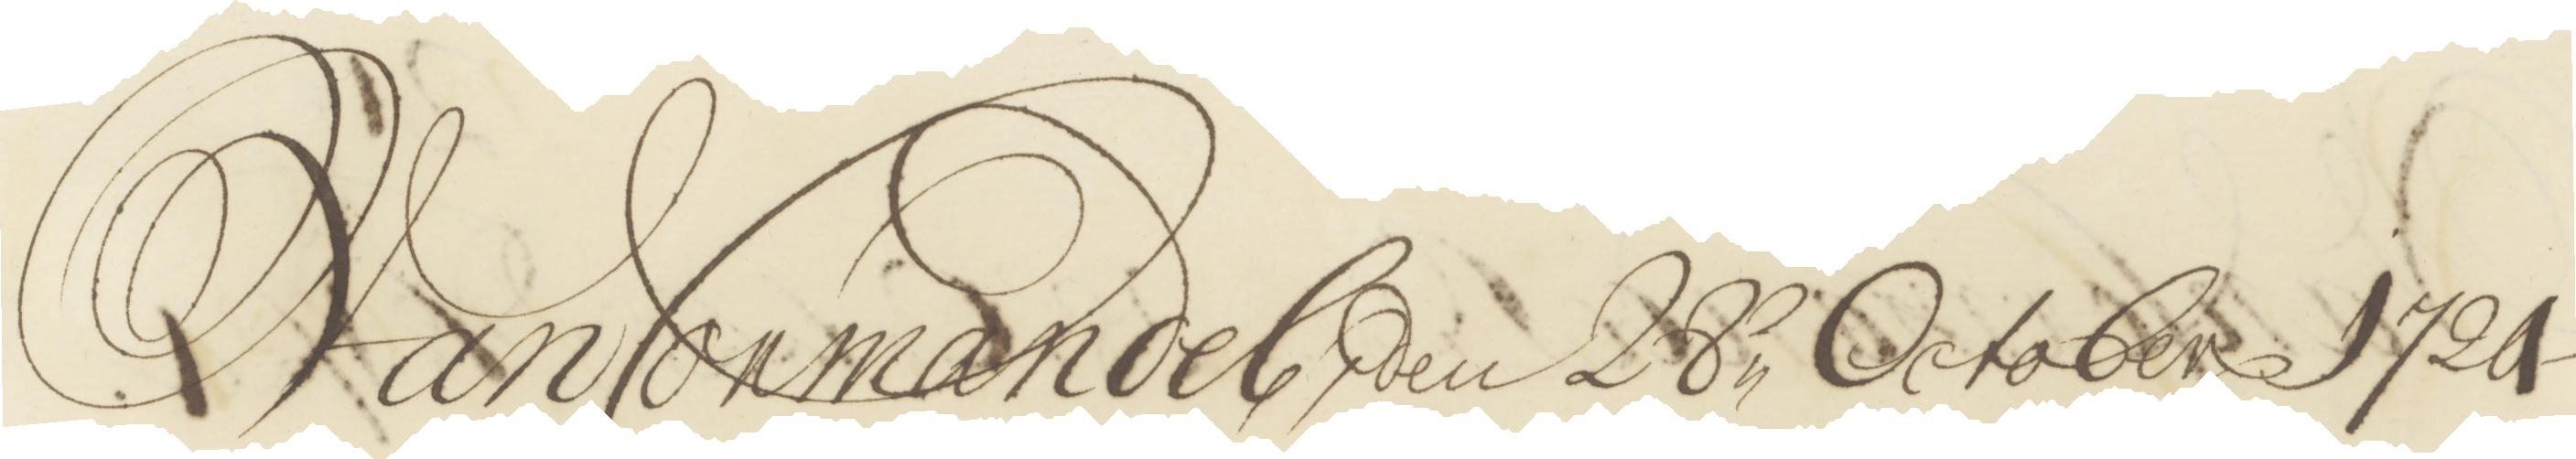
Van Cormandel, den 28„' October 1724
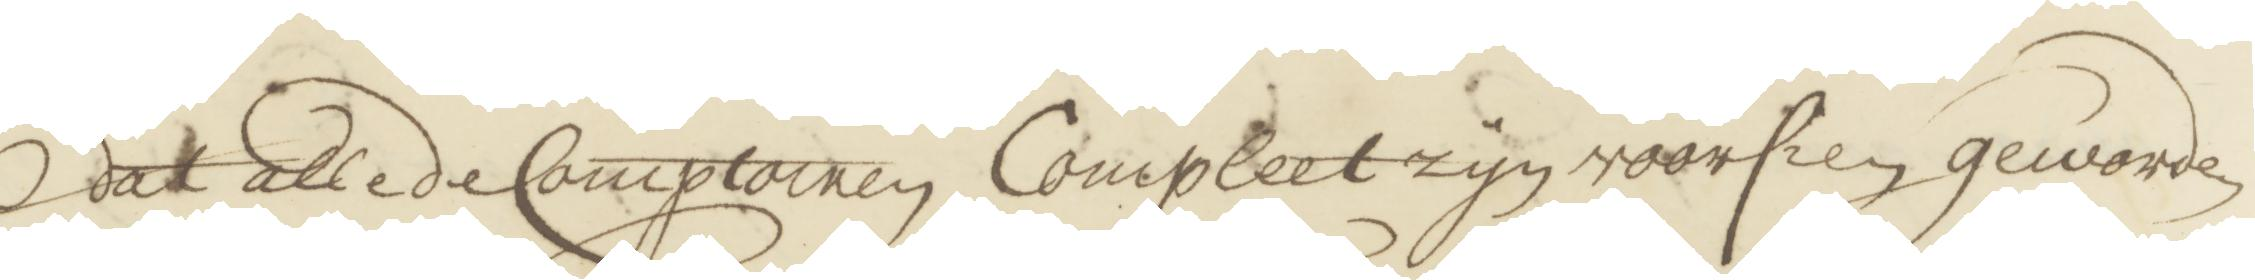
dat alle de comptoiren Compleet zijn voorsien geworden
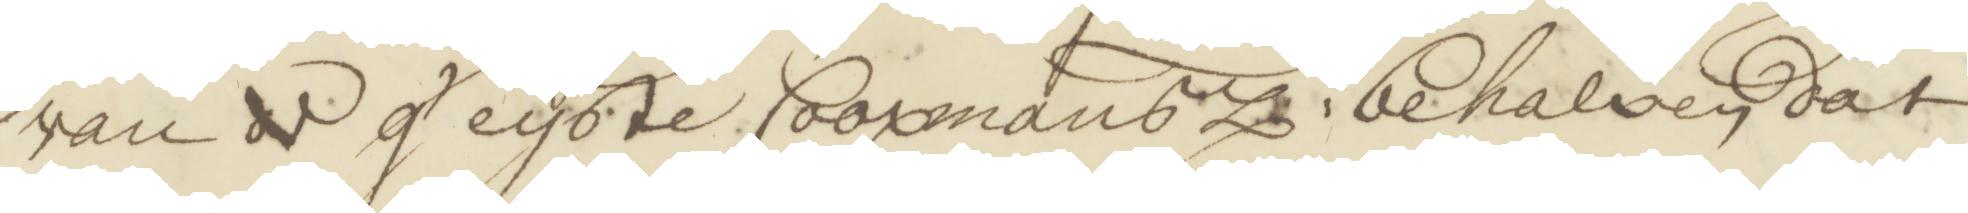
van de g’eijste Coopmansz: behalven dat
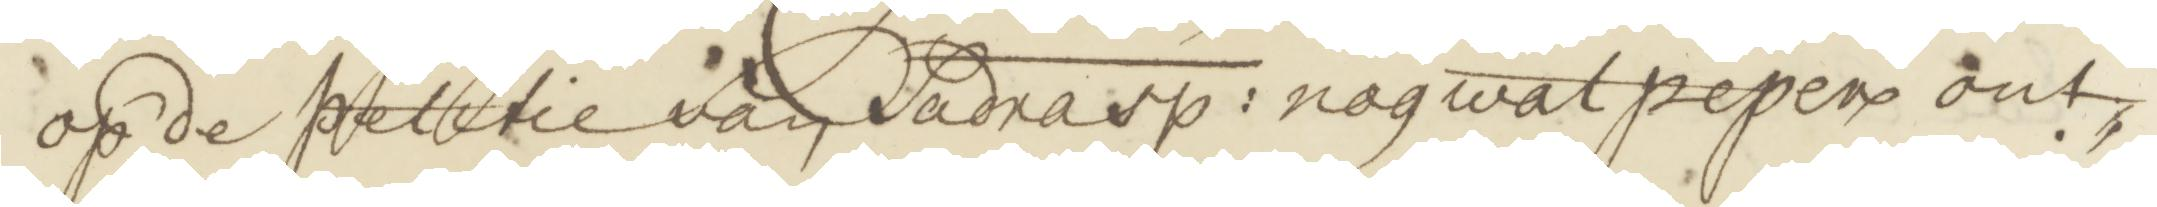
op de petitie van Sadrasp: nog wat peper ont„
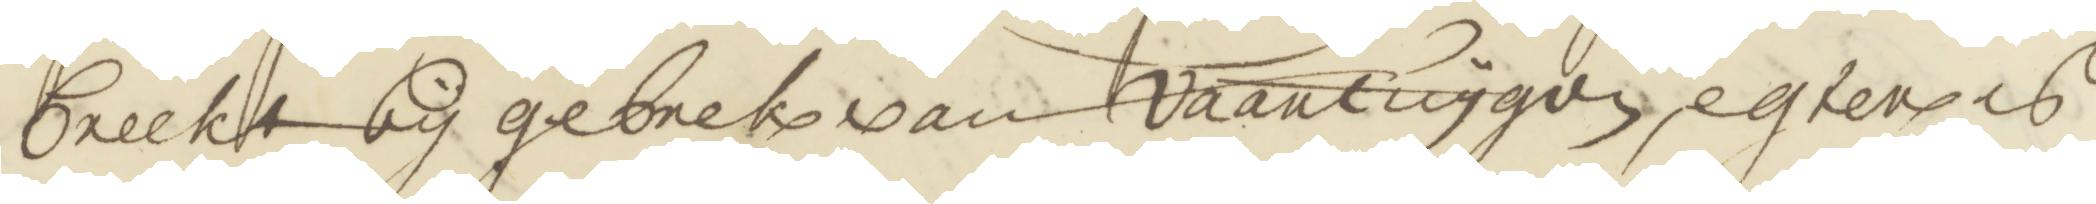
breekt bij gebrek van vaartuijgen, egter is
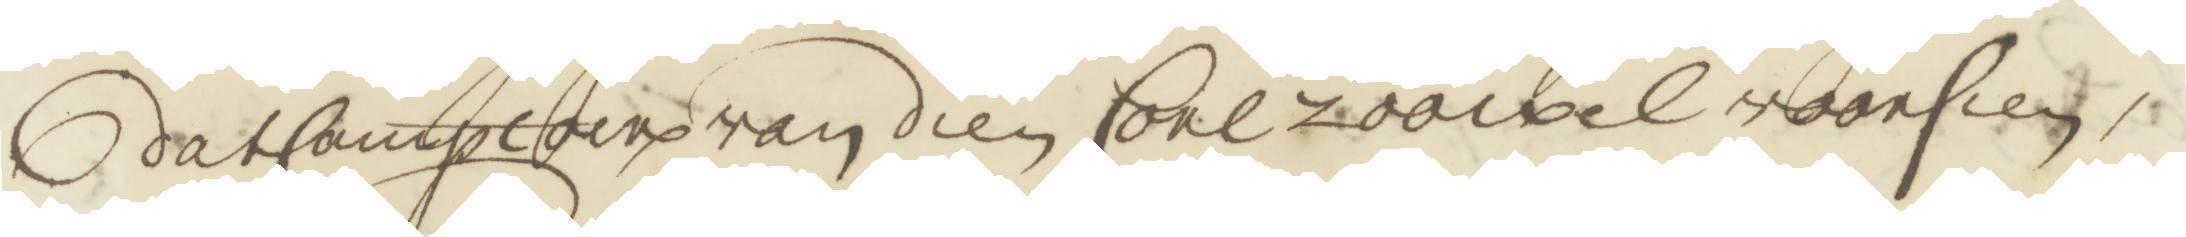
dat Comptoir van dien Corl zoo wel voorsien,
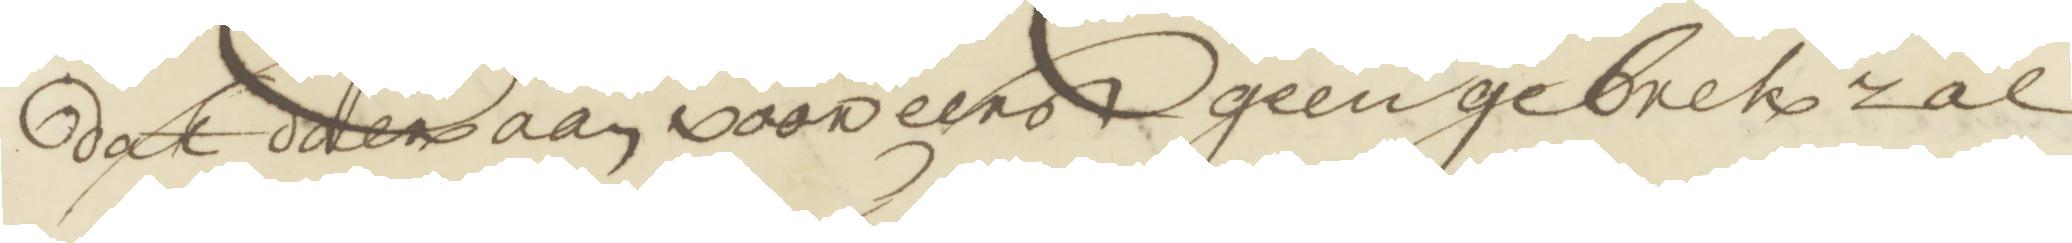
dat daer aan voor eerst geen gebrek zal
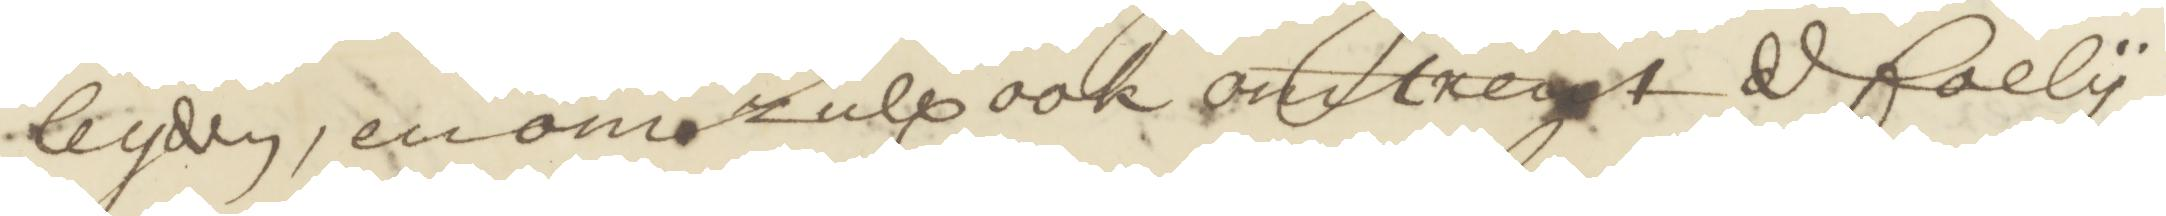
leijden, en om zulx ook omtrent de foelij
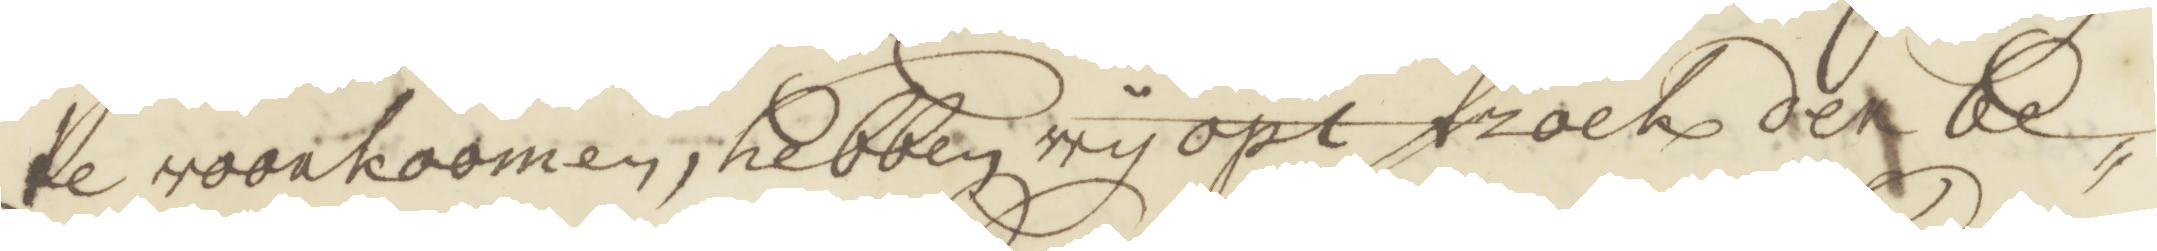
te voorkoomen, hebben wij op ’t verzoek der be„
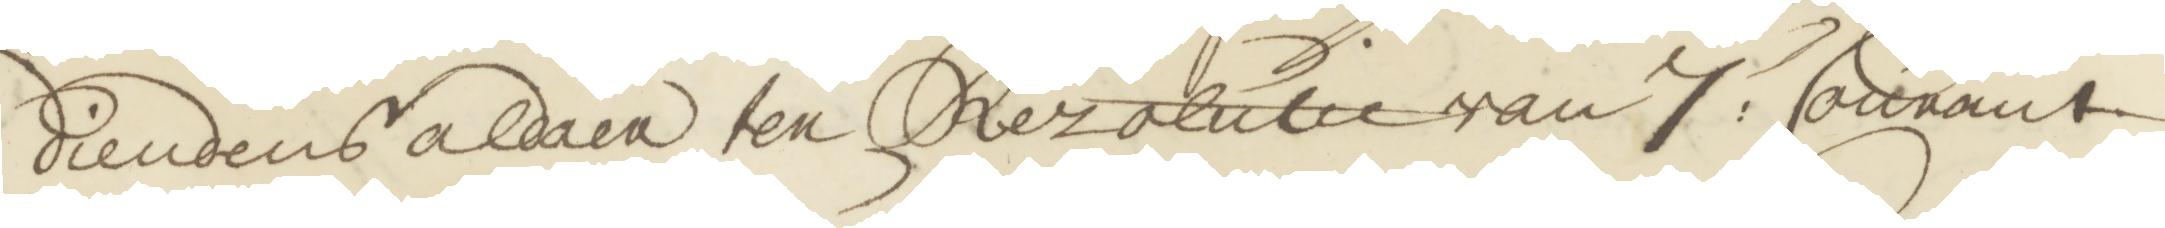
diendens aldaer ter Rezolutie van 7:' Courant
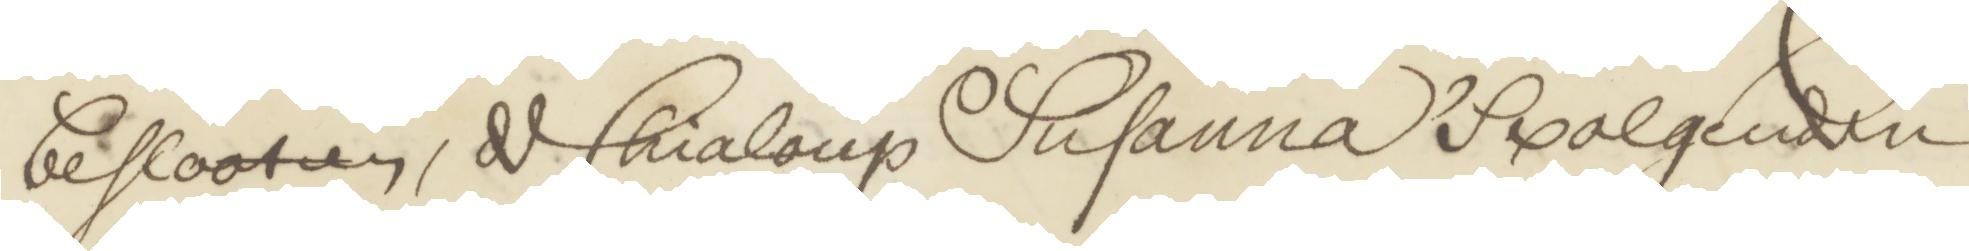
beslooten, de Chialoup Susanna 's volgenden
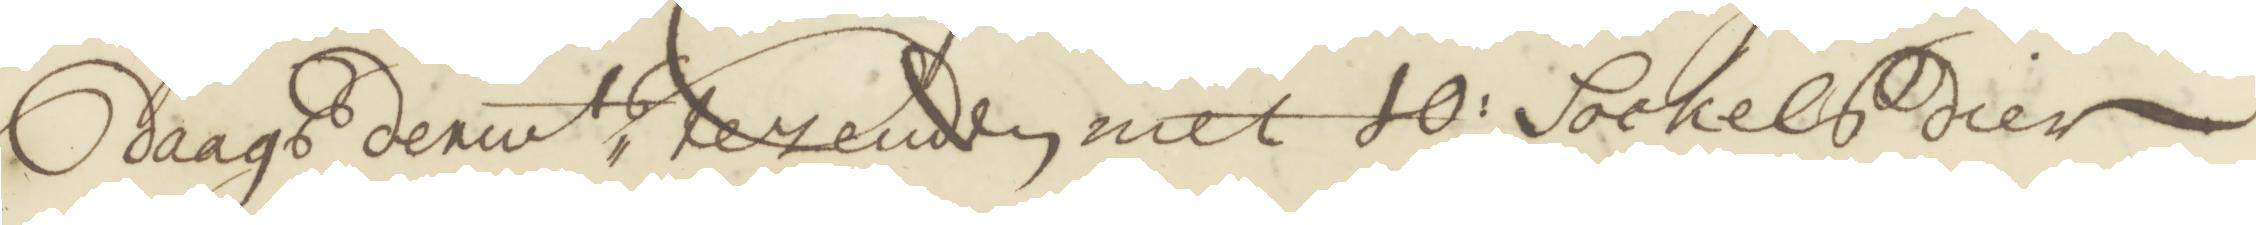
daags derw„ts tezenden met 10: sockels dier
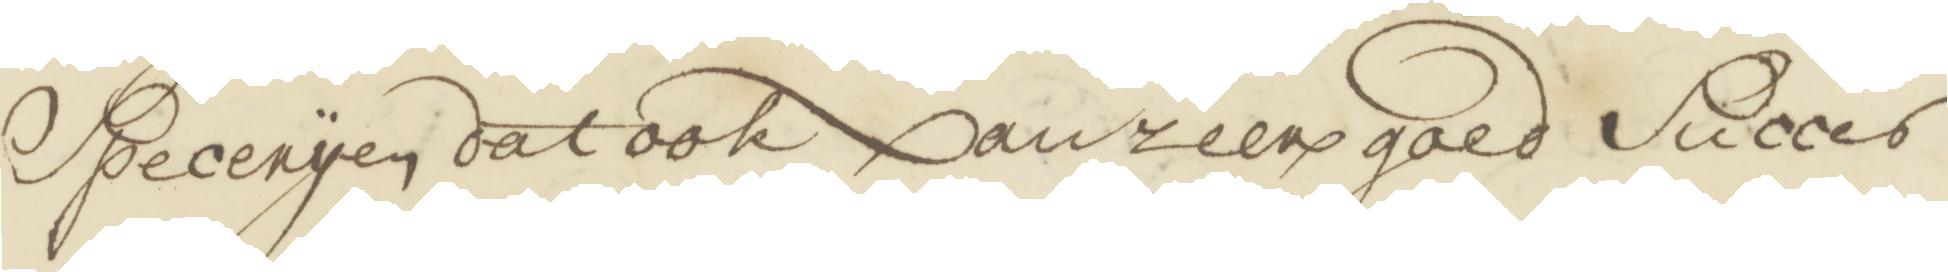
specerijen dat ook van zeer goed Succes
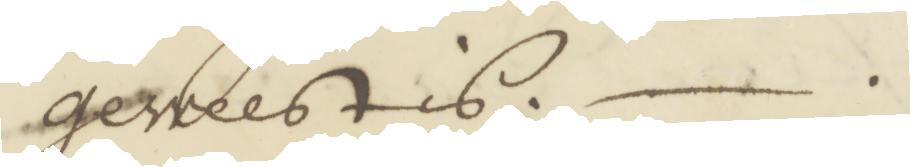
geweest is. — .
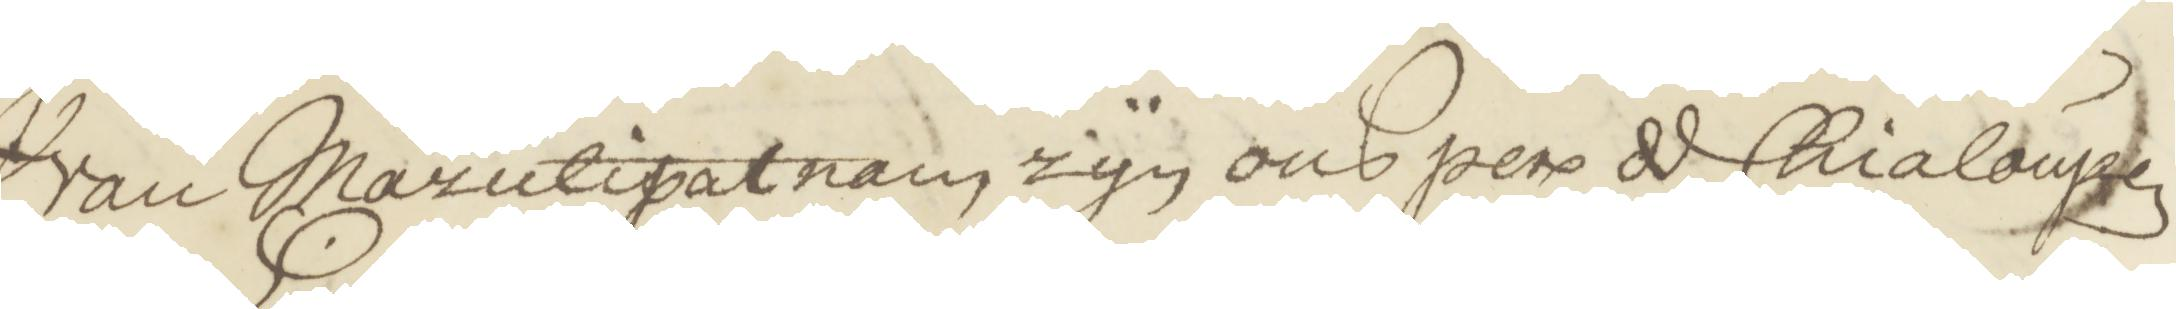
Van Mazulipatnam zijn ons per de Chialoupen
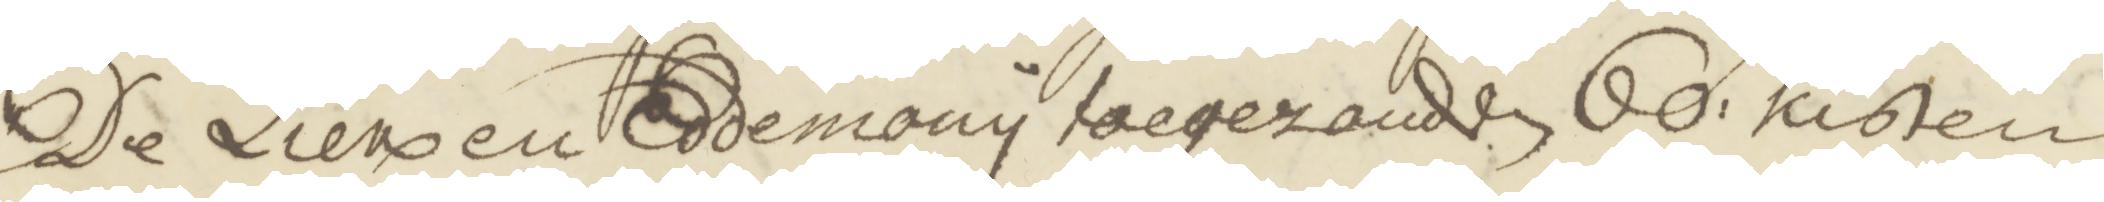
De Lier en Eddemonij toegezonden 60: kisten
